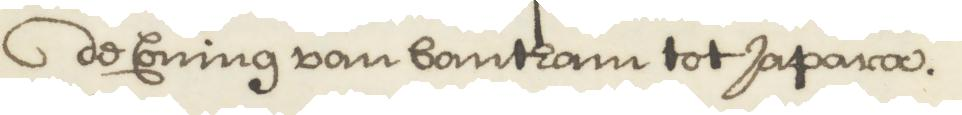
de Coning van bantham tot Japara.
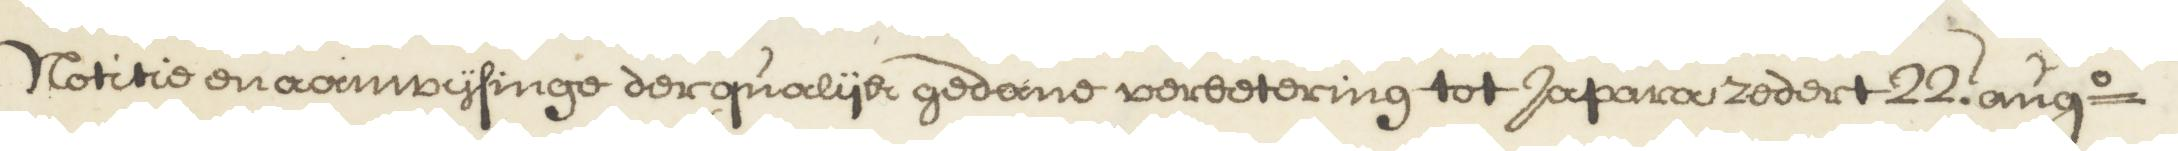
Notitie en aamwijsinge der qualijk gedane verbetering tot Japara zedert 22:' aug=o
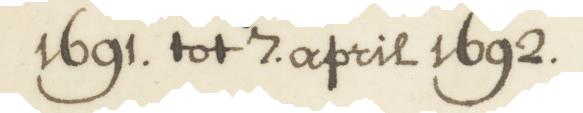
1691. tot 7. april 1692.
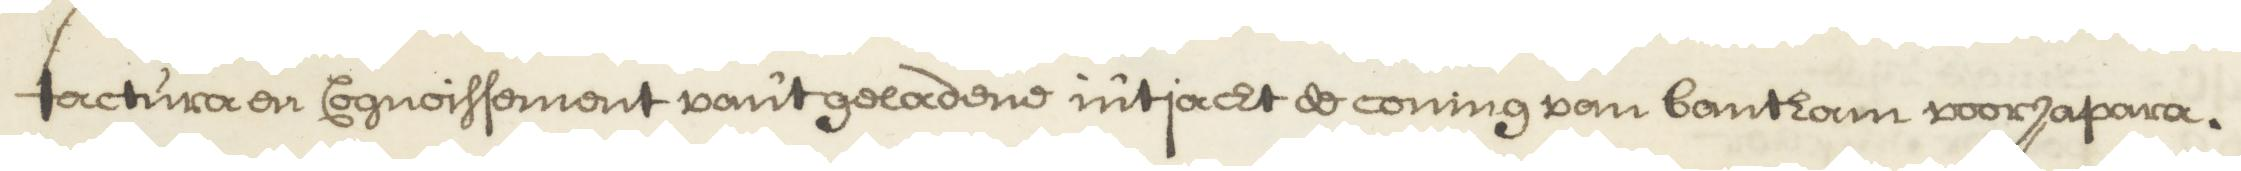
factura en Cognoissement van’t geladene in't jacht de coning van bantham voor Japara.
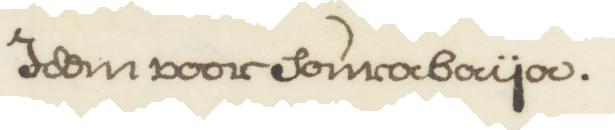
Idem voor sourabaija.
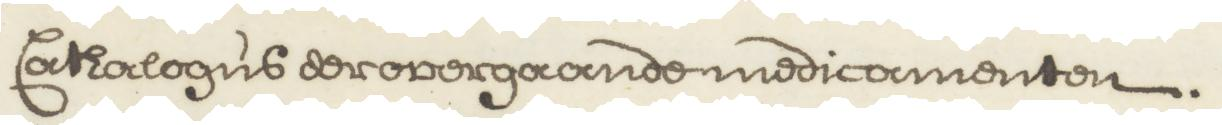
Cathalogus der overgaande medicamenten.
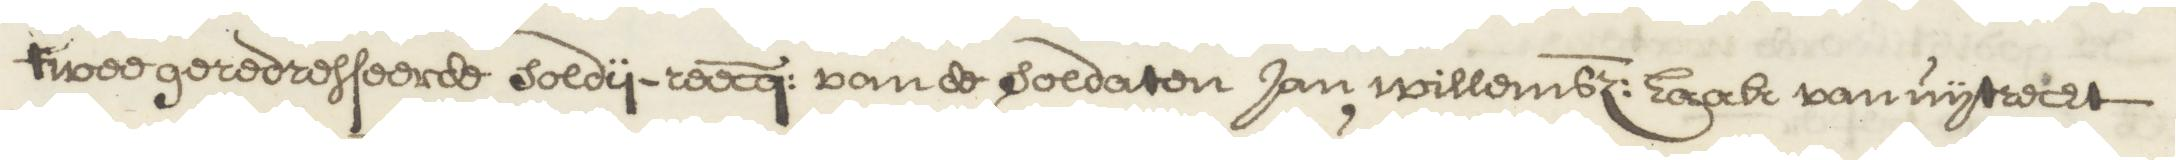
twee geredresseerde soldij-reecq: van de soedaten Jan willemsz: haak van uijtrecht
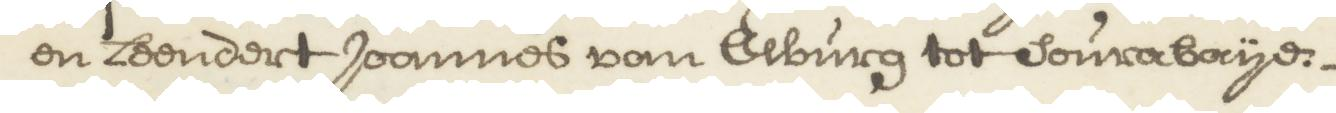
en Leendert Joannes van Elburg tot sourabaije.
